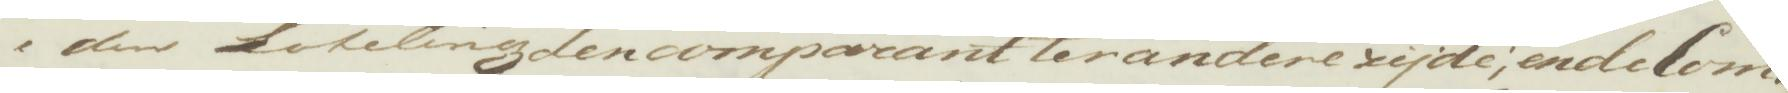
„den Loteling den comparant ter andere zijde; ende Com
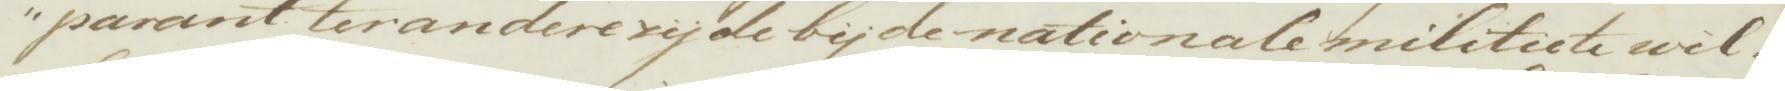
„parant ter andere zijde bij de nationale militie te wil„
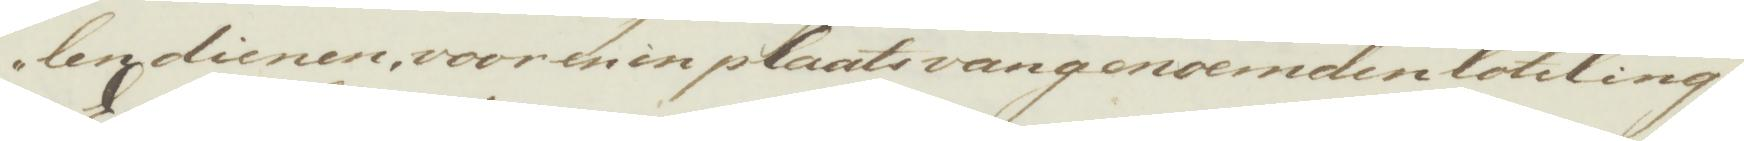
„len dienen, voor en in plaats van genoemden loteling.
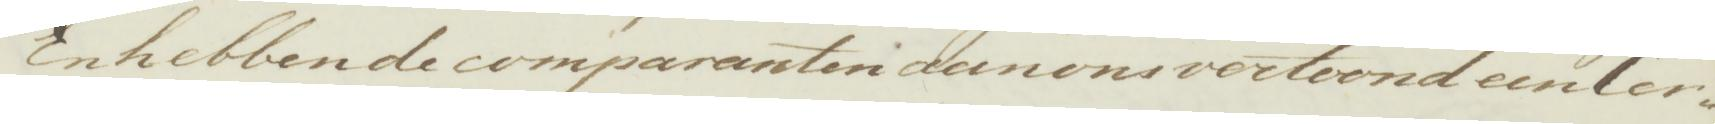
En hebben de comparanten aan ons vertoond een Cer
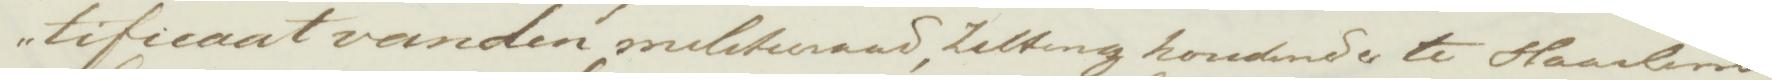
„tificaat van den militieraad, zitting houdende te Haarlem
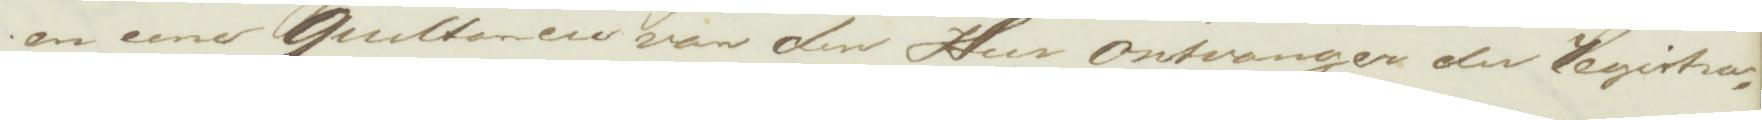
en eene quittancie van den Heer Ontvanger der registra„
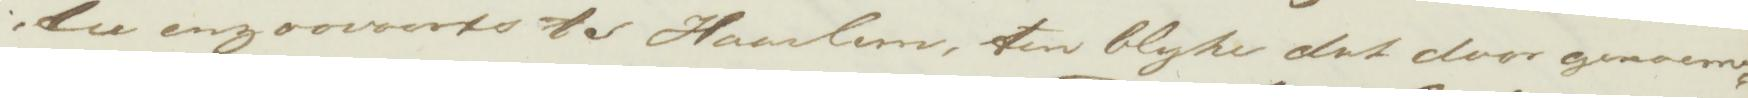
„tie enzoovoorts te Haarlem, ten blyke dat door genoem
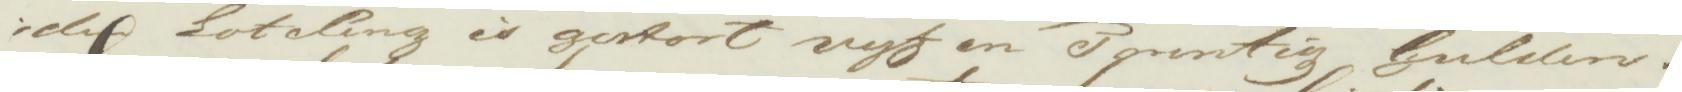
de Loteling is gestort vyf en Twintig Gulden.
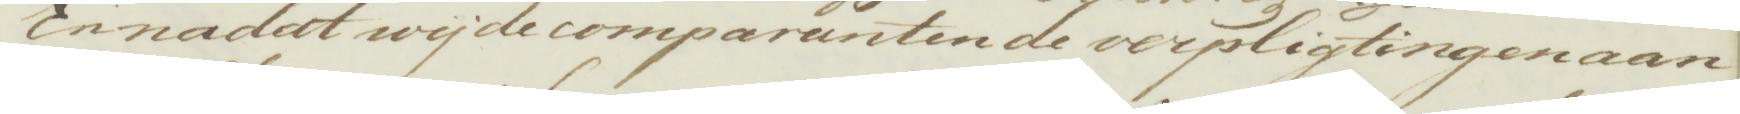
En nadat wij de comparanten de verpligtingen aan
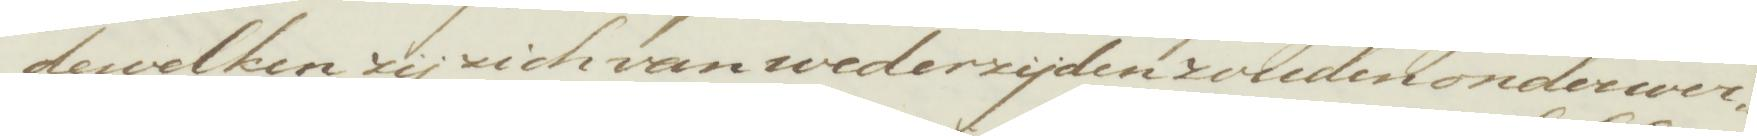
dewelken zij zich van wederzijden zouden onderwer„
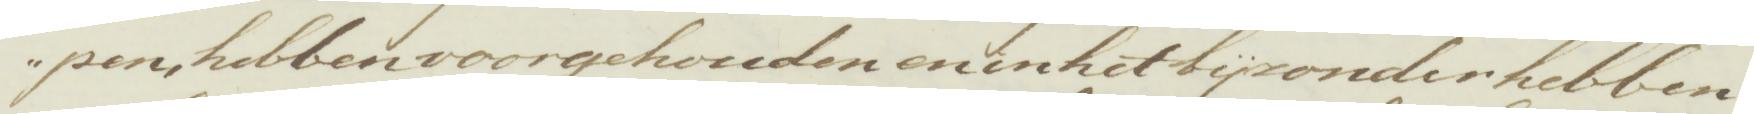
„pen, hebben voorgehouden en in het bijzonder hebben
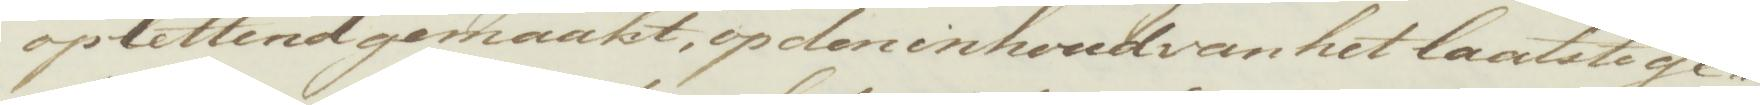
oplettend gemaakt, op den inhoud van het laatste ge„
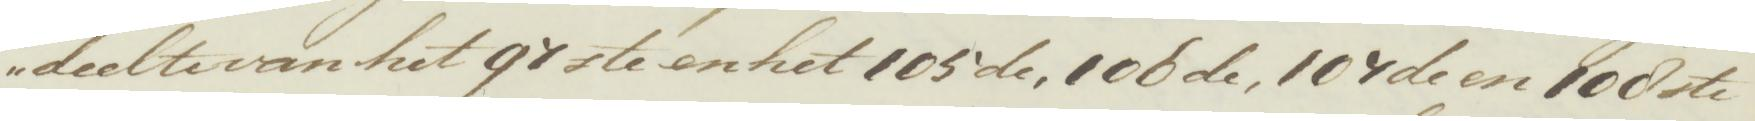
„deelte van het 97ste en het 105de, 106de, 107de en 108ste
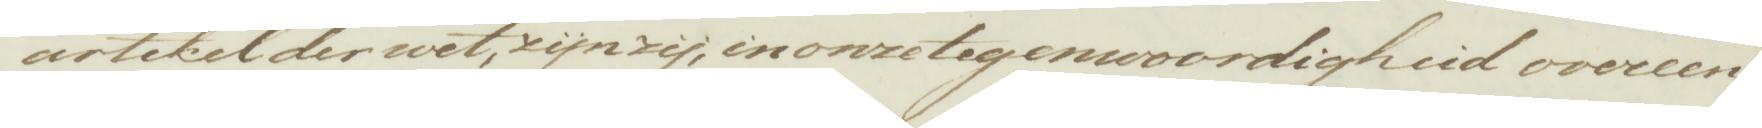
artikel der wet, zijn zij, in onze tegenwoordigheid overeen
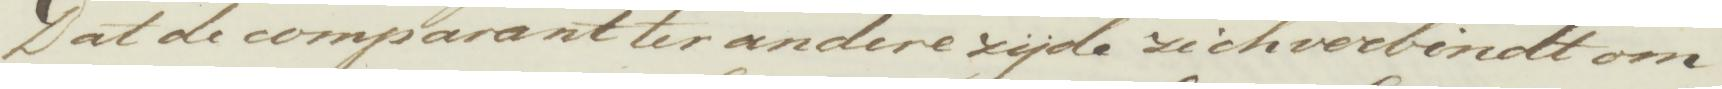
Dat de comparant ter andere zijde zich verbindt om
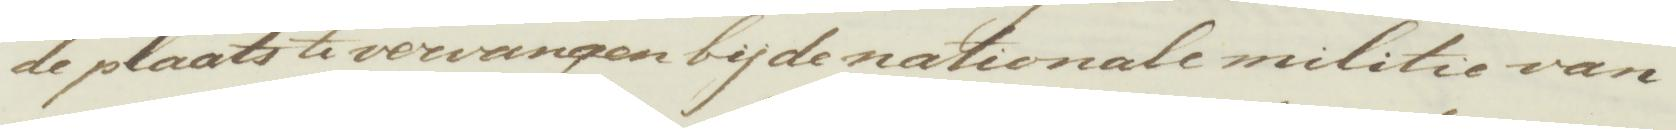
de plaats te vervangen bij de nationale militie van
